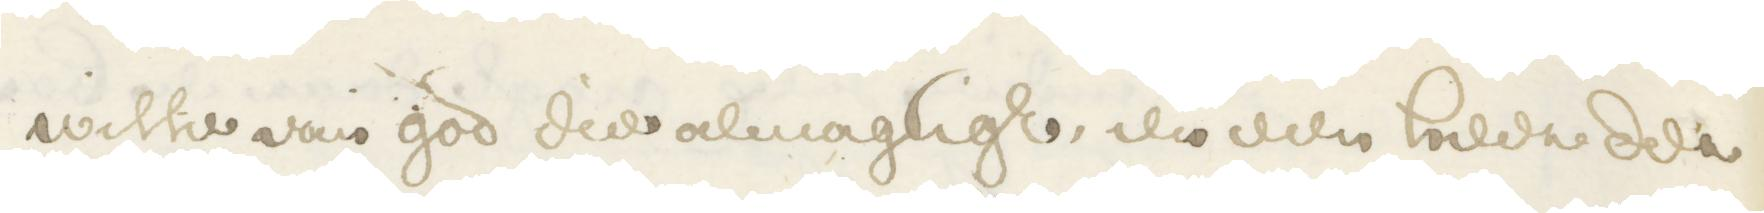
wilke van god die almagtigh, en een heer der
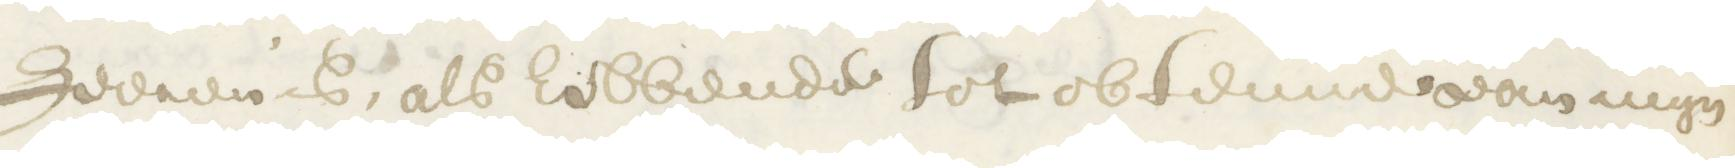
Heeren is, als hebbende tot obtenie van mijn
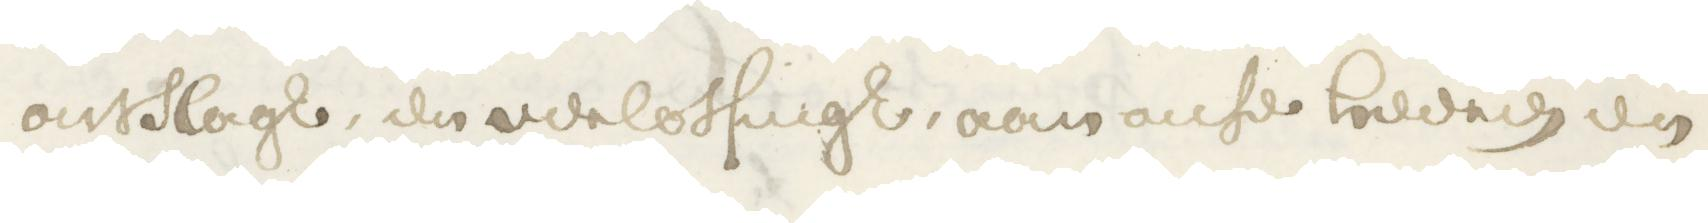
ontslagh, en verlossingh, aan onse heeren en
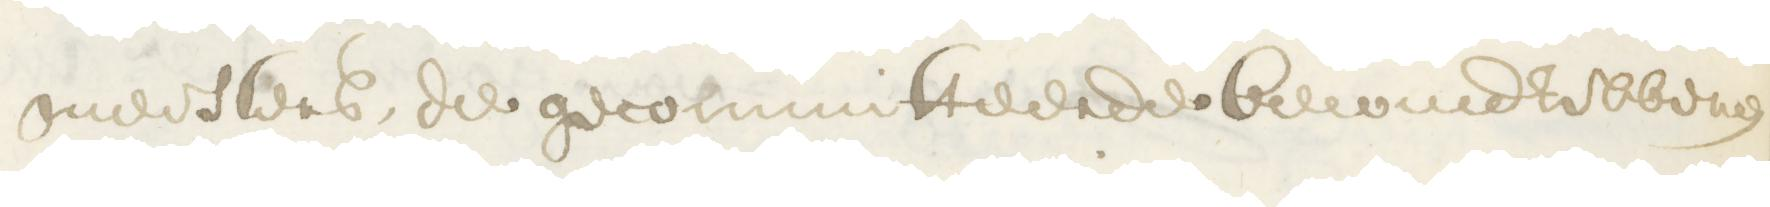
meesters, de gecommitteerde bewindhebberen
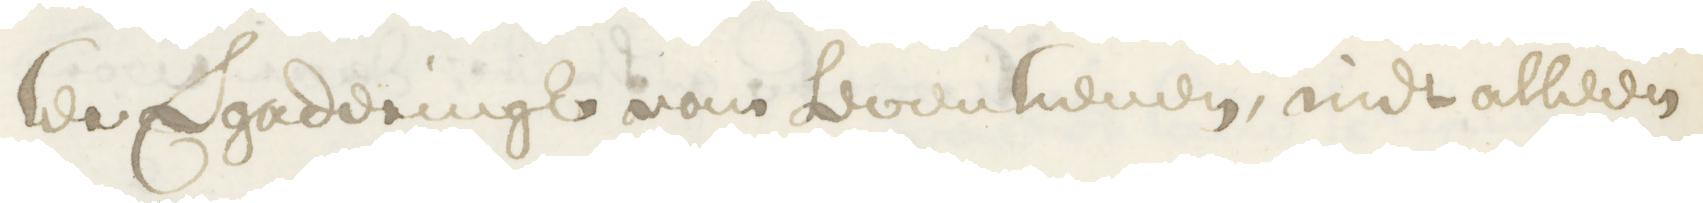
ter vergaderingh van seventienen, niet alleen
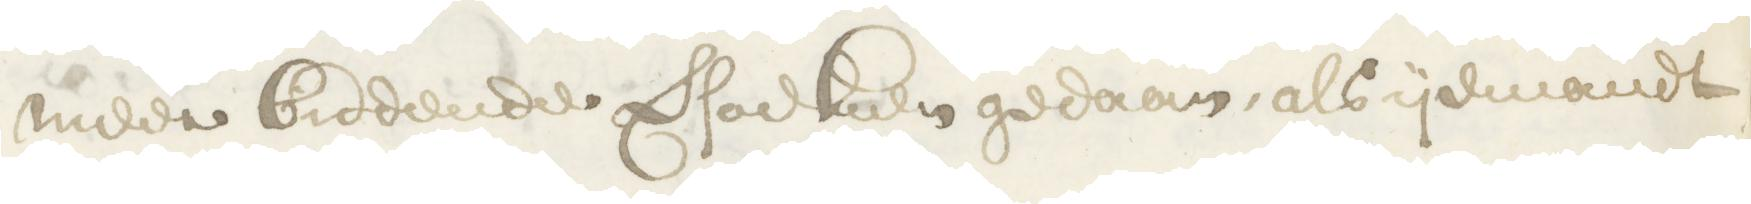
meer biddende versoeken gedaan, als ijemandt
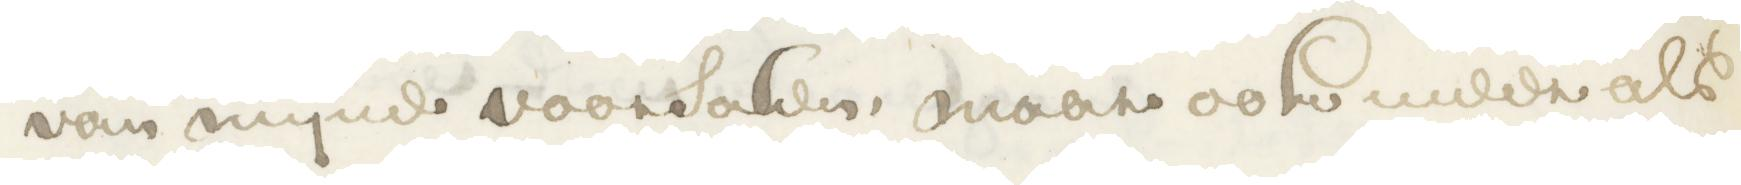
van mijne voorsaken, maar ook meer als
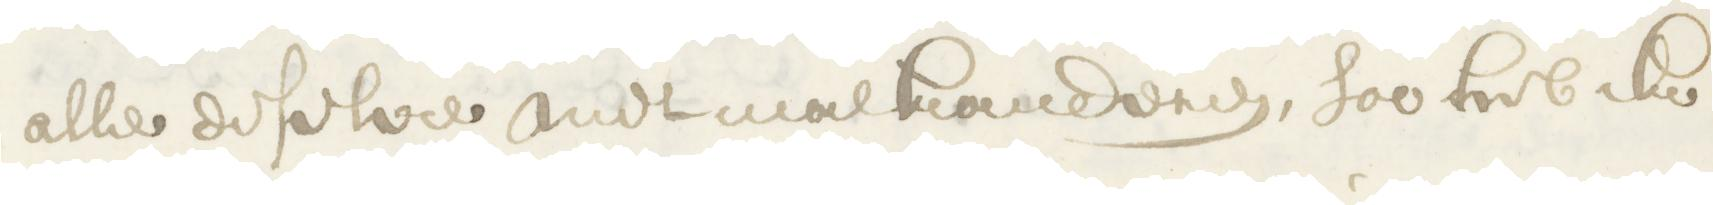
alle deselve met malkanderen, soo heb ik
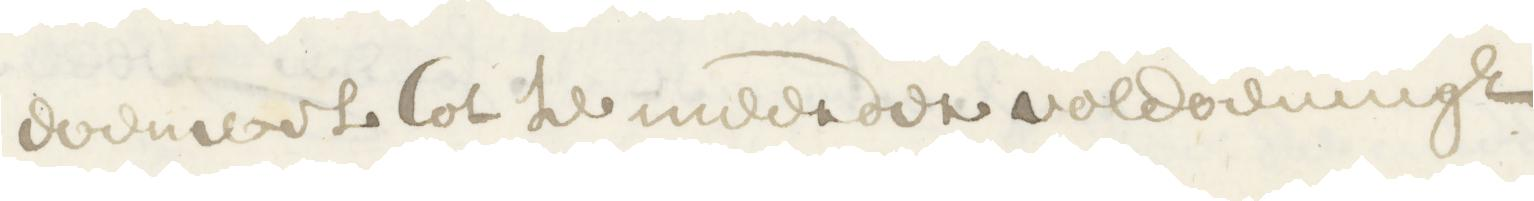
evenwel tot te meer der voldoeningh
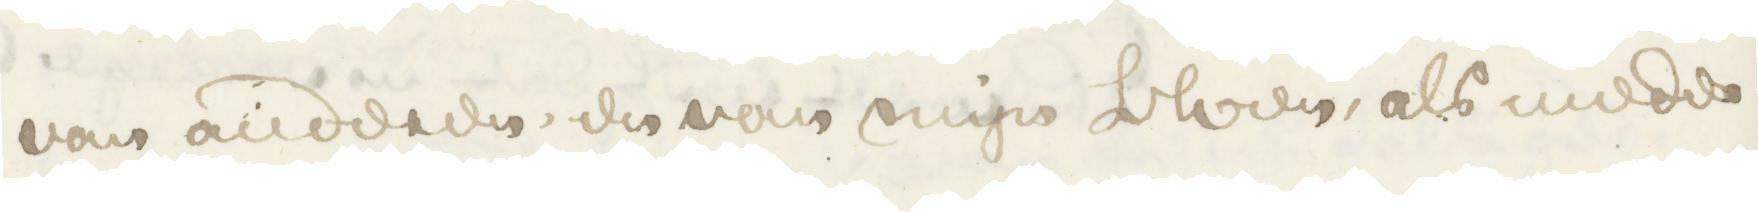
van anderen, en van mijn selven, als mede
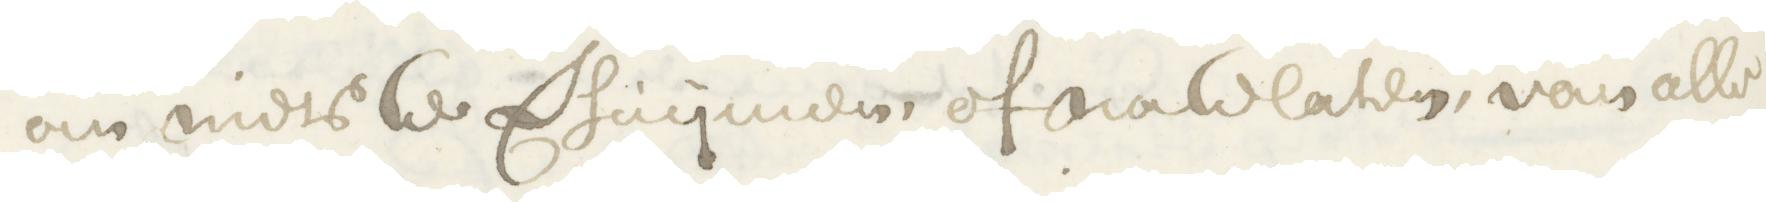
om niets te versuijmen, of natelaten, van alle
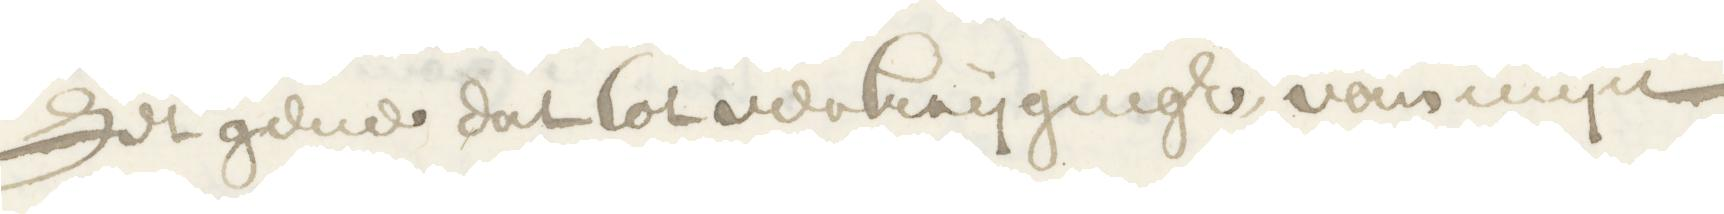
het gene dat tot verkrijgingh, van mijn
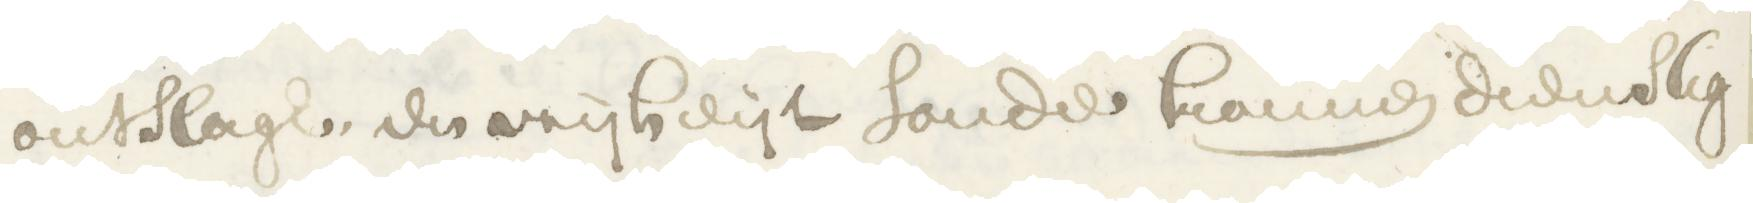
ontslagh, en vrijheijt soude konnen dienstig
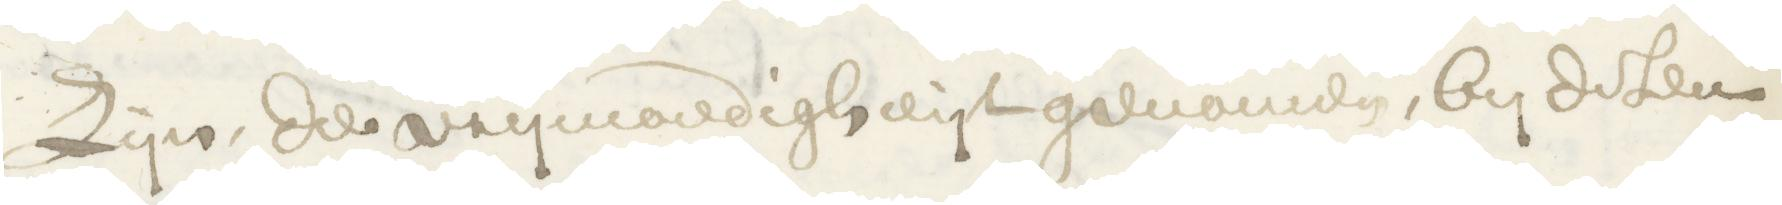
zijn, de vrijmoedigheijt genomen, bij desen
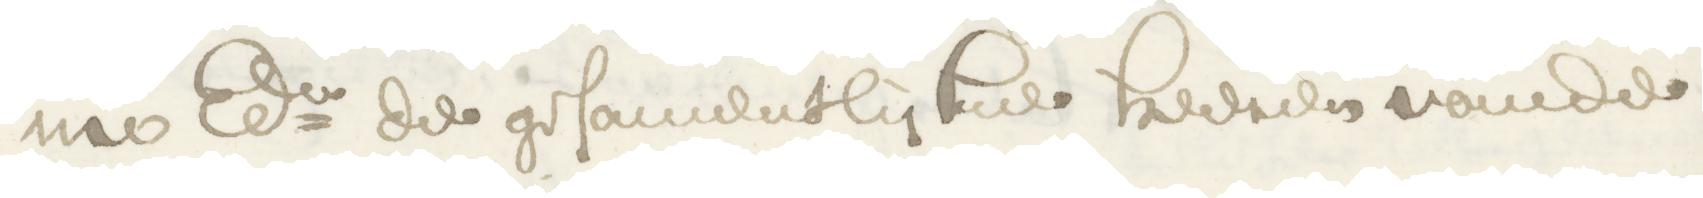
uw Ed=e de gesamentlijke keeren vande
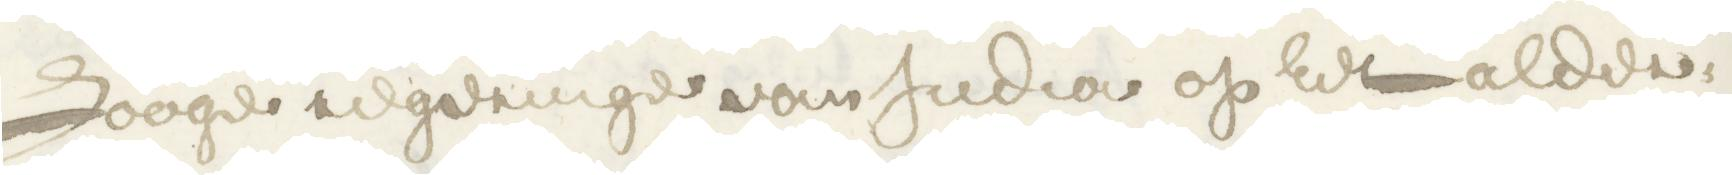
hooge regeringe van Judia op het alder„
